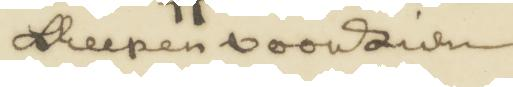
scheepen voorzien
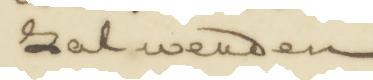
zal werden
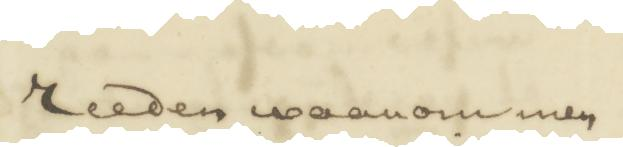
Reeden waarom men
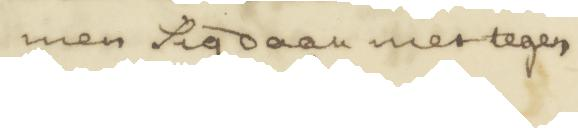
men sig daar niet tegen
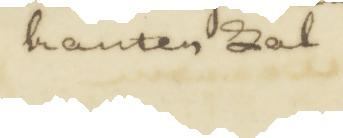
kanten zal
